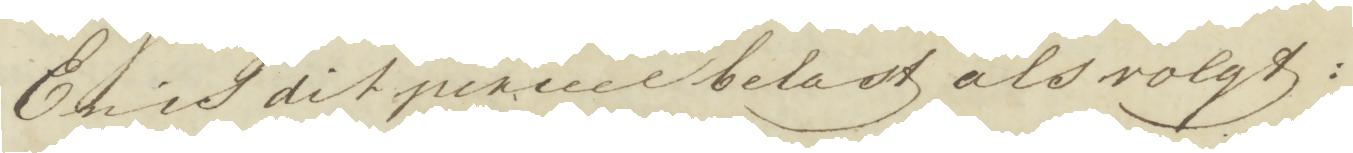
En is dit perceel belast als volgt:
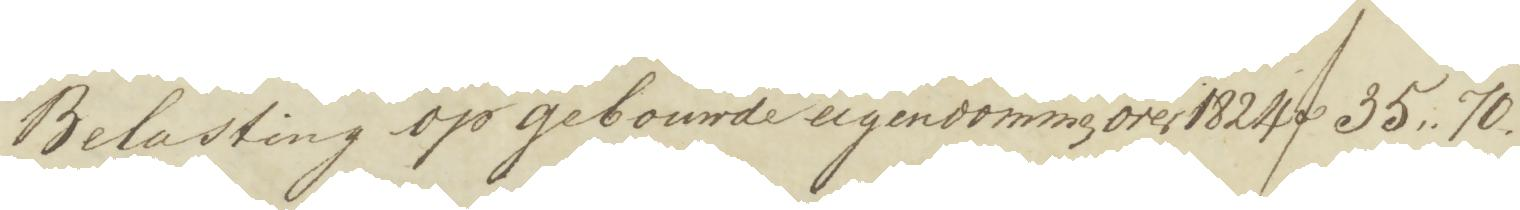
Belasting op gebouwde eigendommen over 1824 ƒ 35„70.
